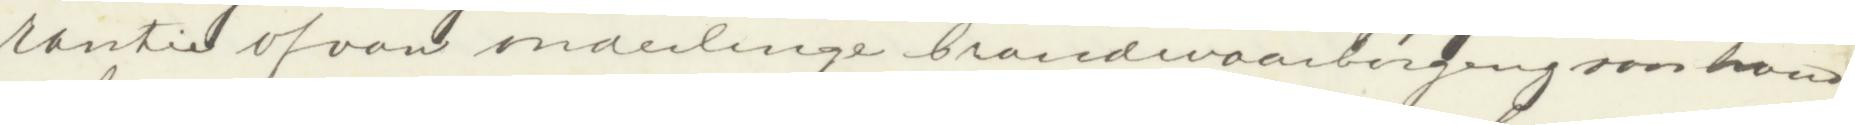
rantie of van onderlinge brandwaarborging voor brand
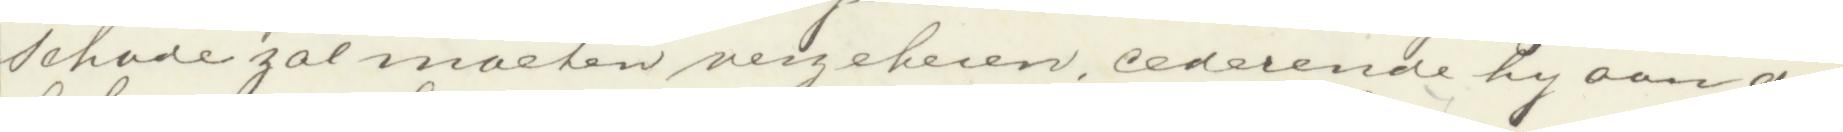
schade zal moeten verzekeren, cederende hy aan de
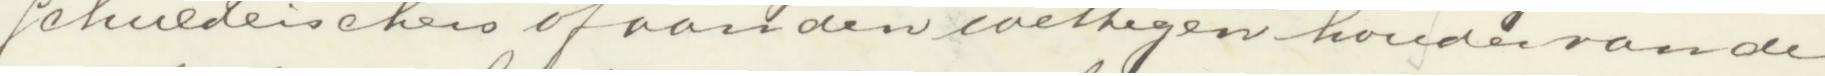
schuldeischers of aan den wettigen houder van de
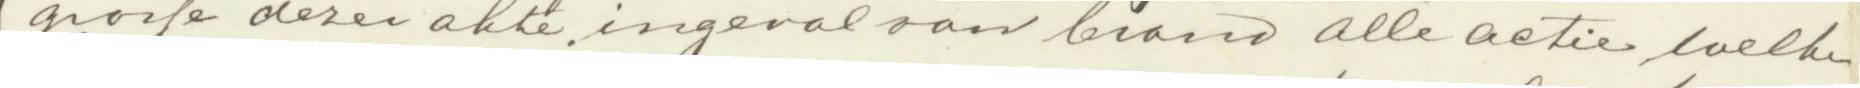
grosse dezer akte, ingeval van brand alle actie, welke
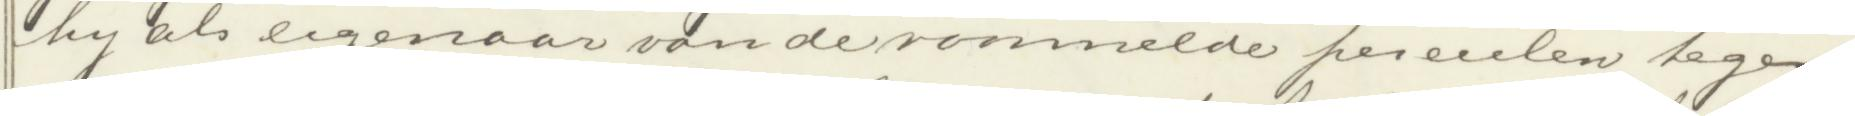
hy als eigenaar van de voormelde perceelen tegen
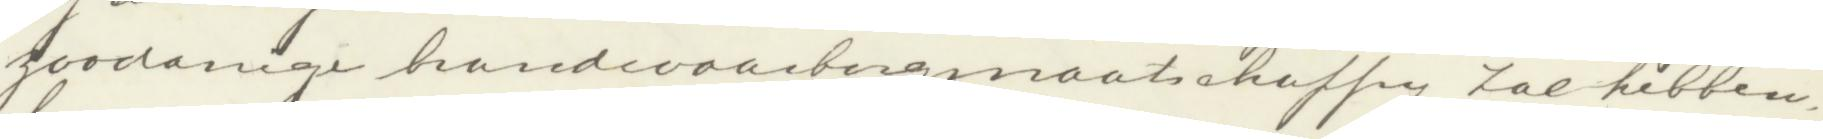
zoodanige brandwaarborgmaatschappy zal hebben,
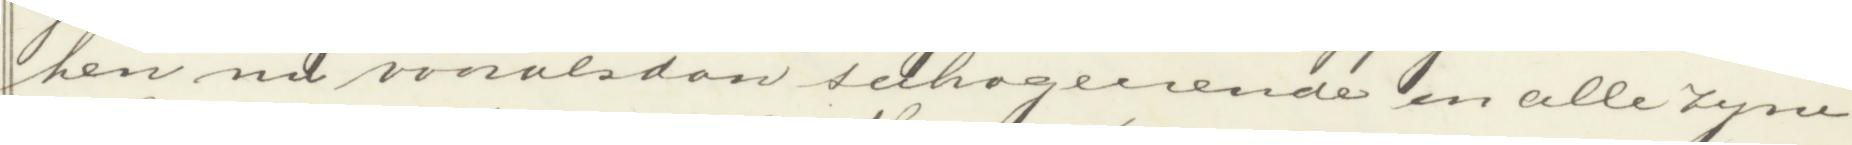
hen nu voorals dan subrogeerende in alle zyne
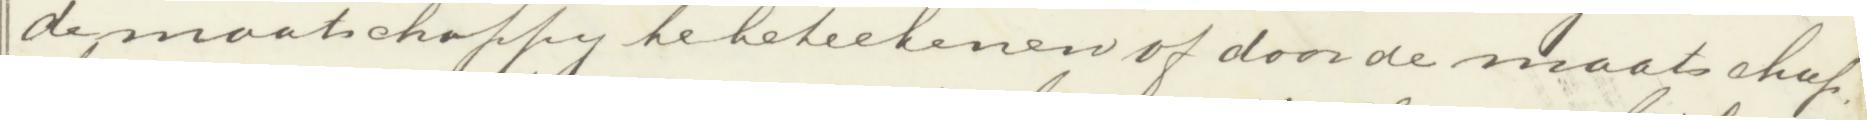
de maatschappy te beteekenen of door de maatschap,
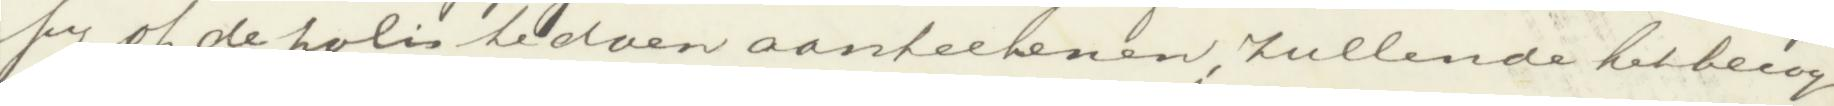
py op de polis te doen aanteekenen, zullende het becoq
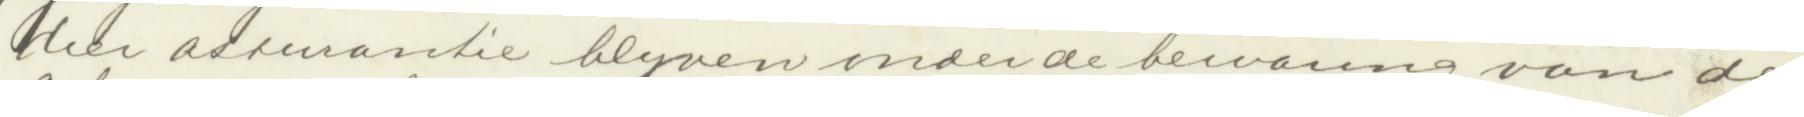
dier aassurantie blyven onder de bewaring van de
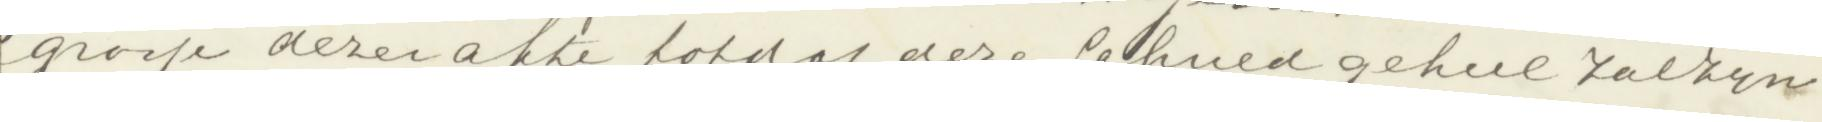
grosse dezer akte, tot dat deze schuld geheel zal zyn
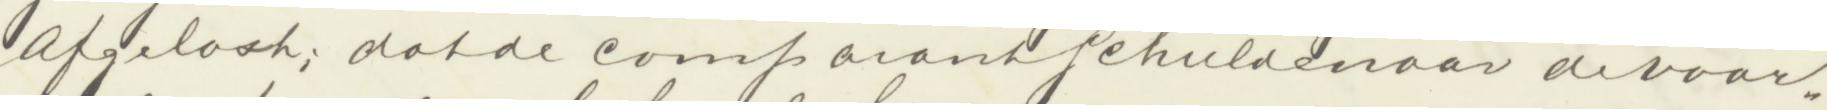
afgelost; dat de comparant schuldenaar de voor„
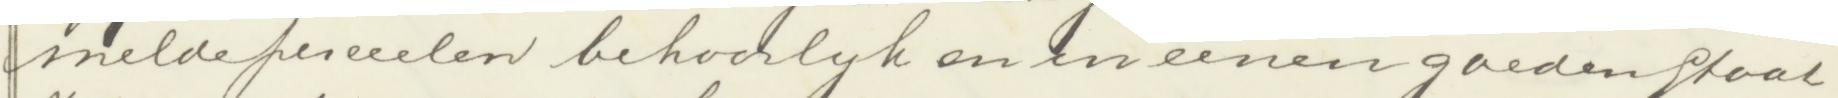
melde perceelen behoorlyk en in eenen goeden staat
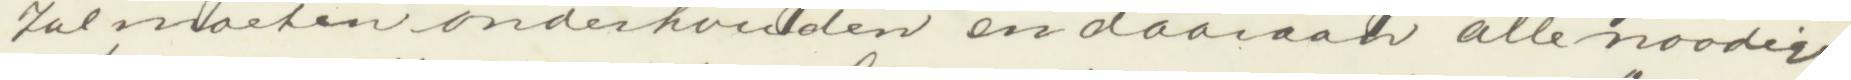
zal moeten onderhouden en daaraan alle noodige
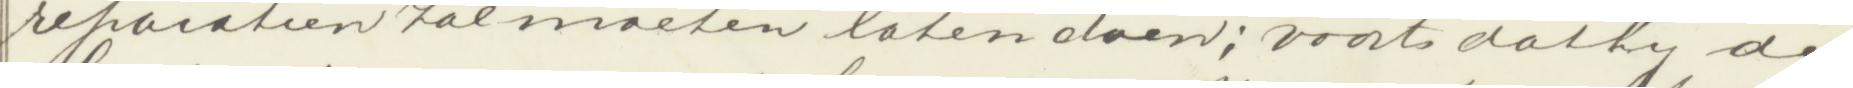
Reparatien zal moeten laten doen; voorts dat hy de
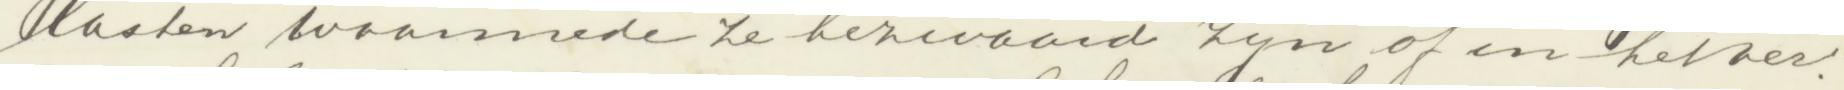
lasten waarmede ze bezwaard zyn of in het ver„
